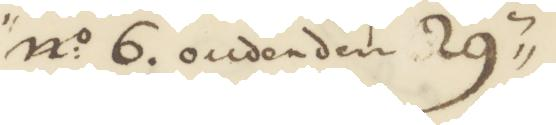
N:o 6. onder den 29„en
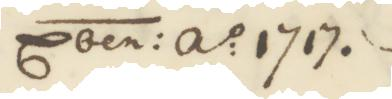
xber: A:o 1717.
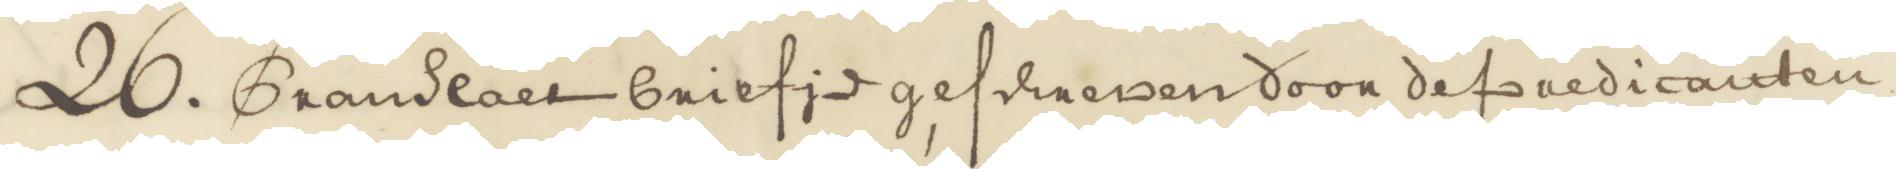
26. Translaet briefje geschreven door de predicanten
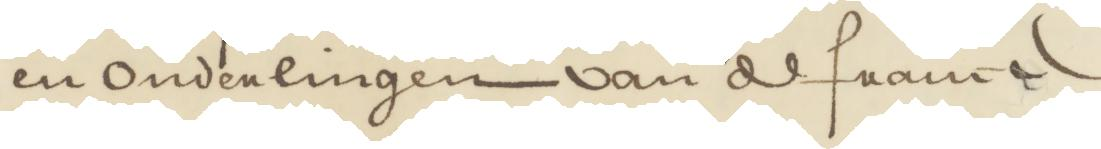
en ouderlingen van de france
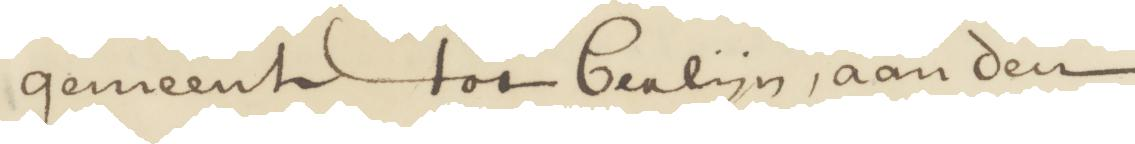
gemeente tot berlijn, aan den
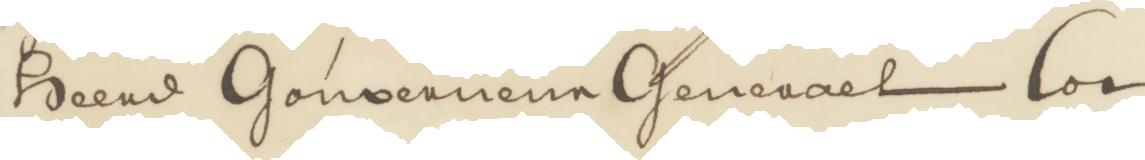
Heere Gouverneur Generael tot
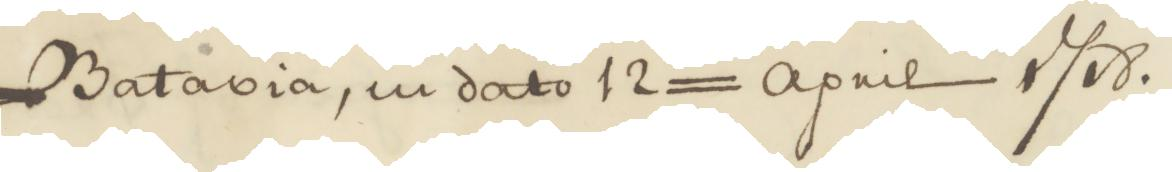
Batavia, in dato 12=en April 1718.
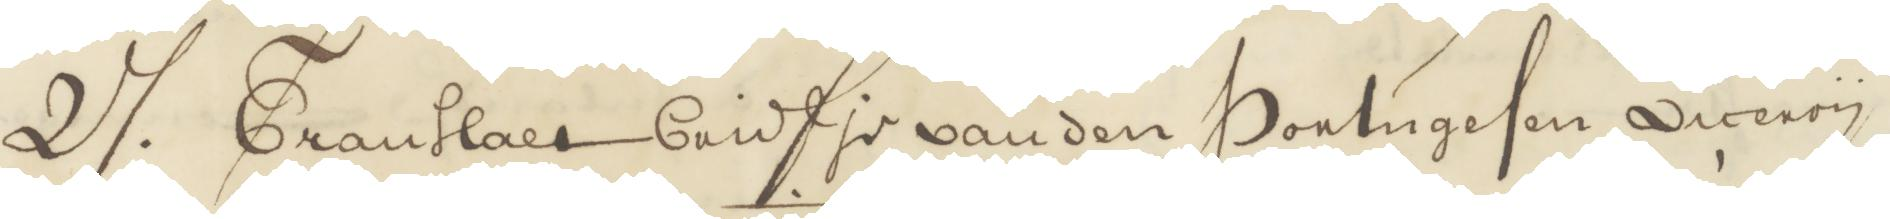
27. Translaet briefje van den Portugesen viceroij
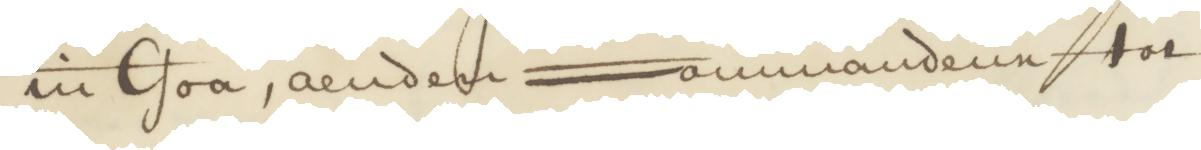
in Goa, aenden commandeur tot
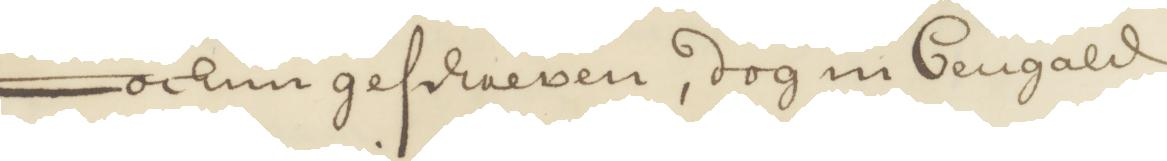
cochim geschreven, dog in bengale
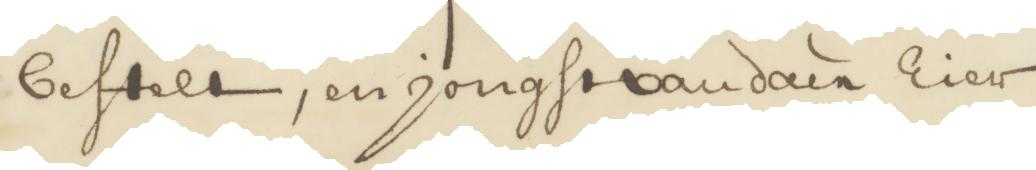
bestelt, en jongst van daer hier
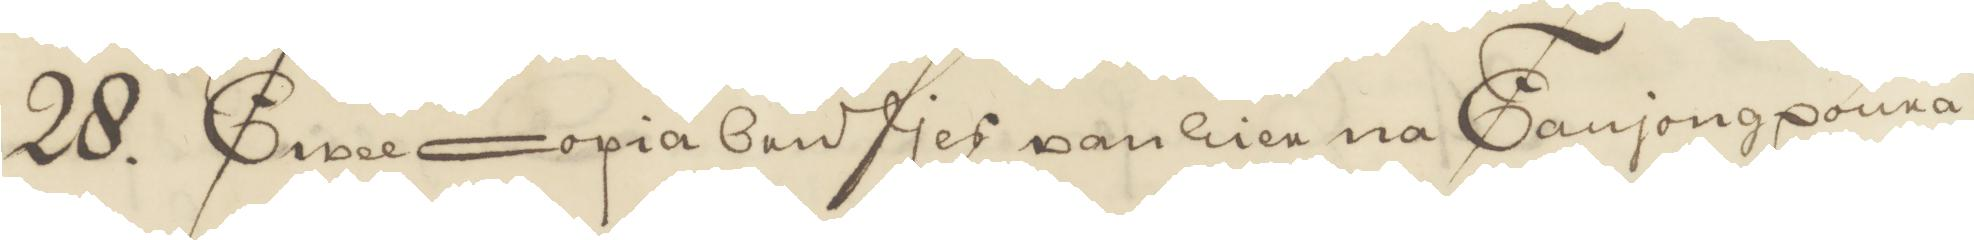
28. Twee copia briefjes van hier na Tanjongpoura
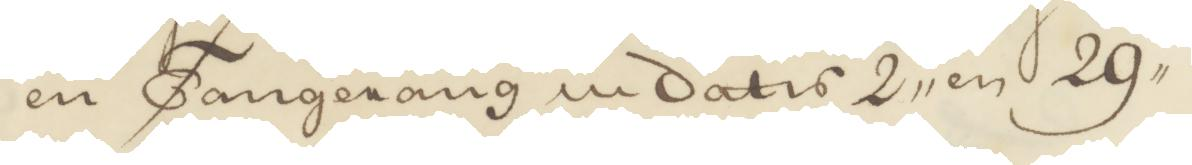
en Tangerang in datis 2„n en 29„n
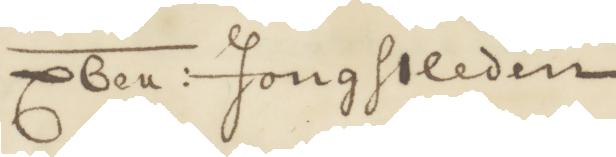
xber: Jongstleden
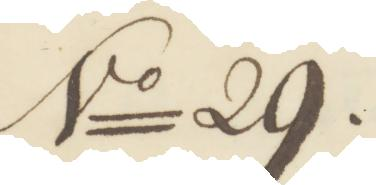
N=o 29.
